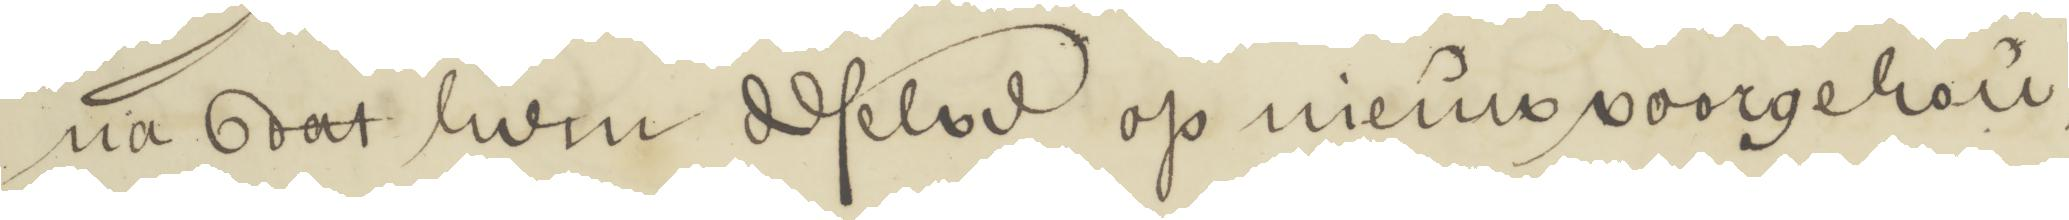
na dat hem deselve op nieuw voorgehou„
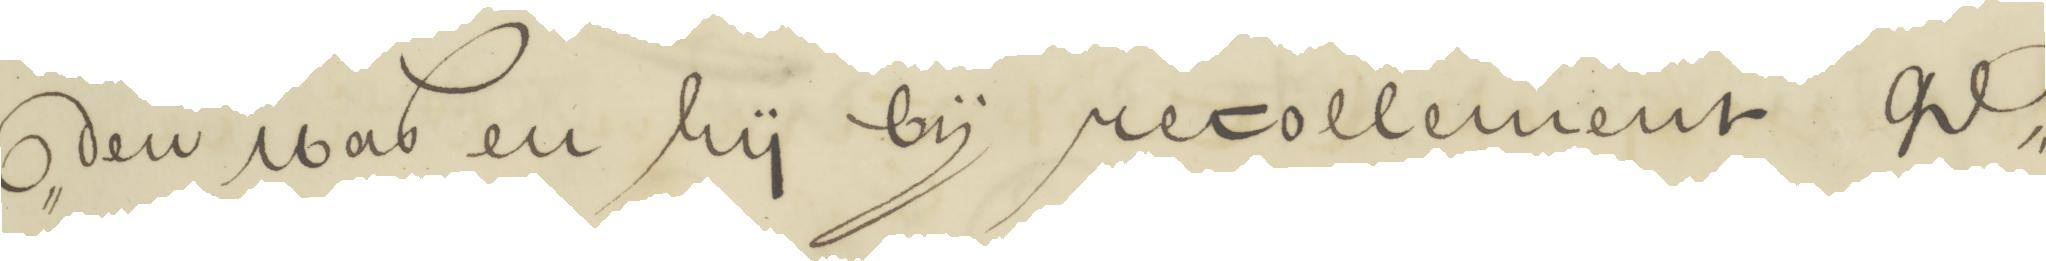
„den was en hij bij recollement ge„
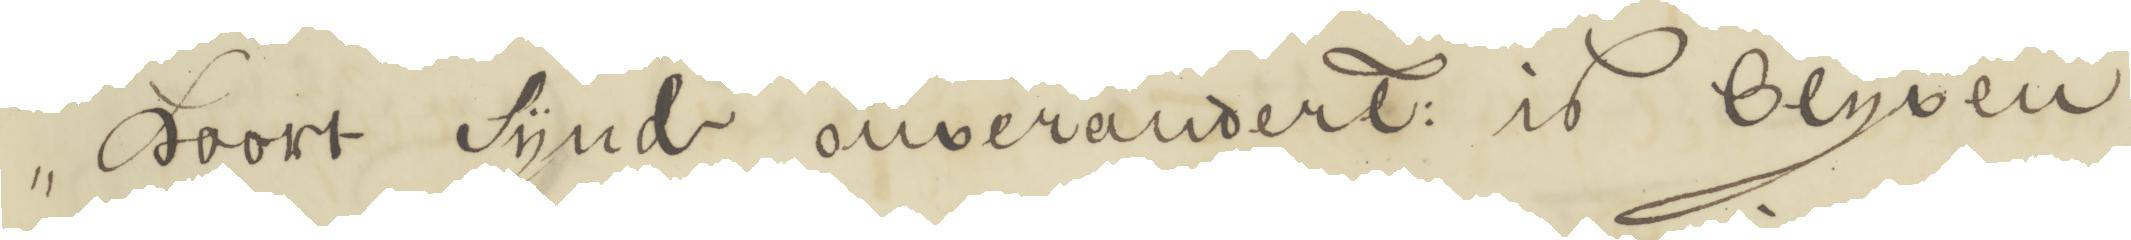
„ hoort sijnde onveranderl: is blijven
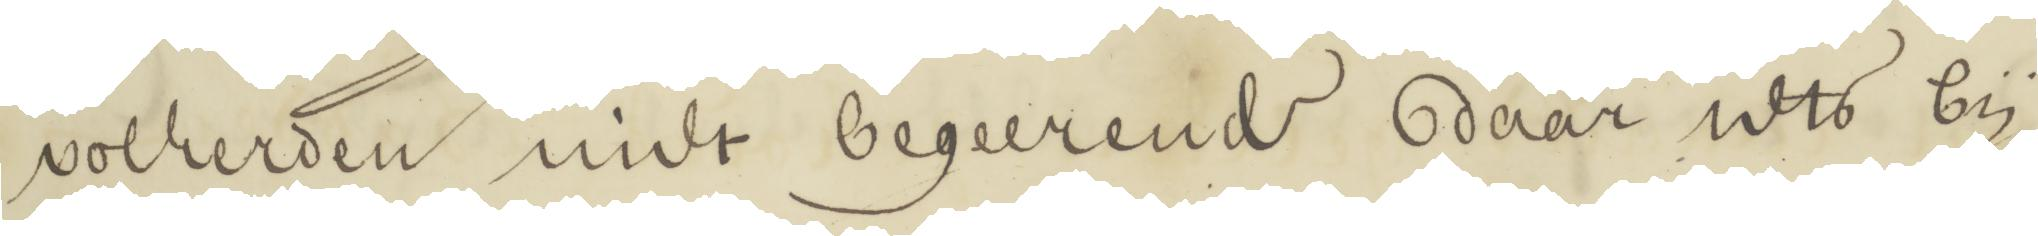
volherden niet begeerende daar iets bij
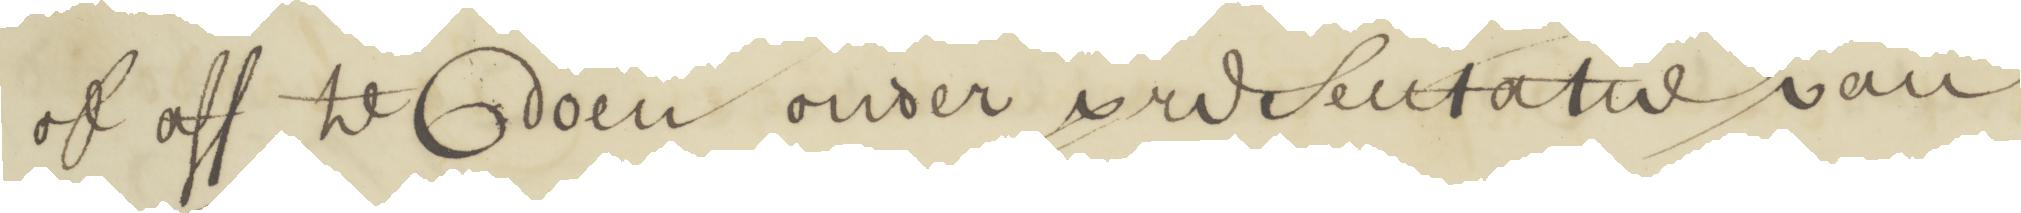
of aff te doen onder presentatie van
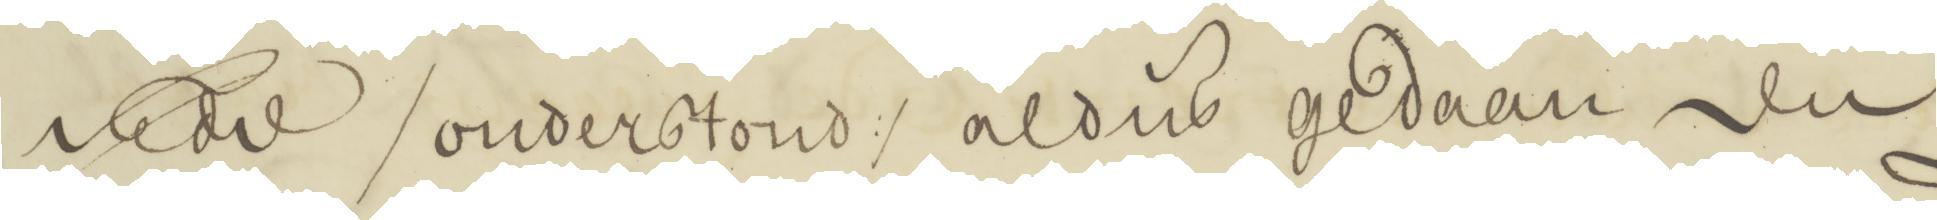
eede / onderstond:/ aldus gedaan en
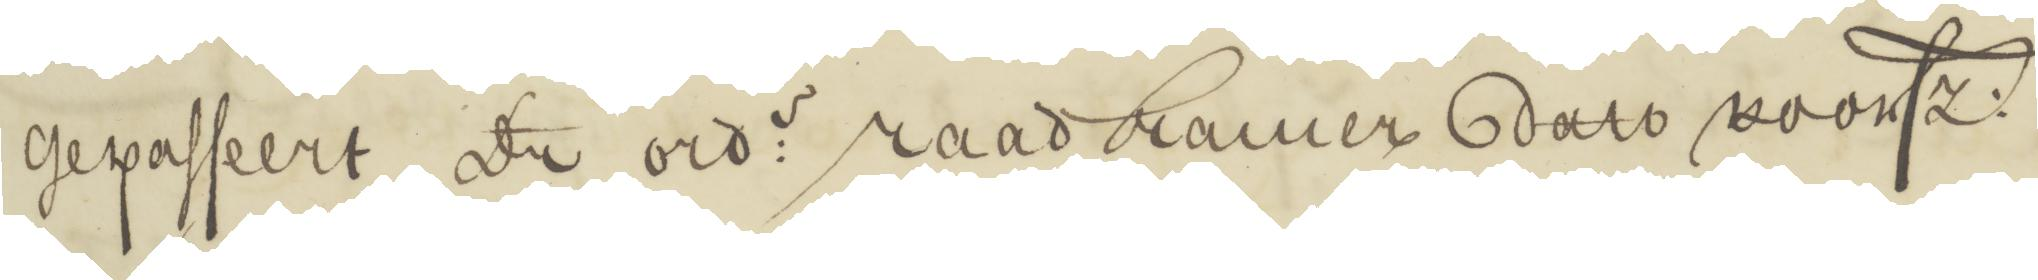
gepasseert ter ord:' raadkamer dato voorsz:
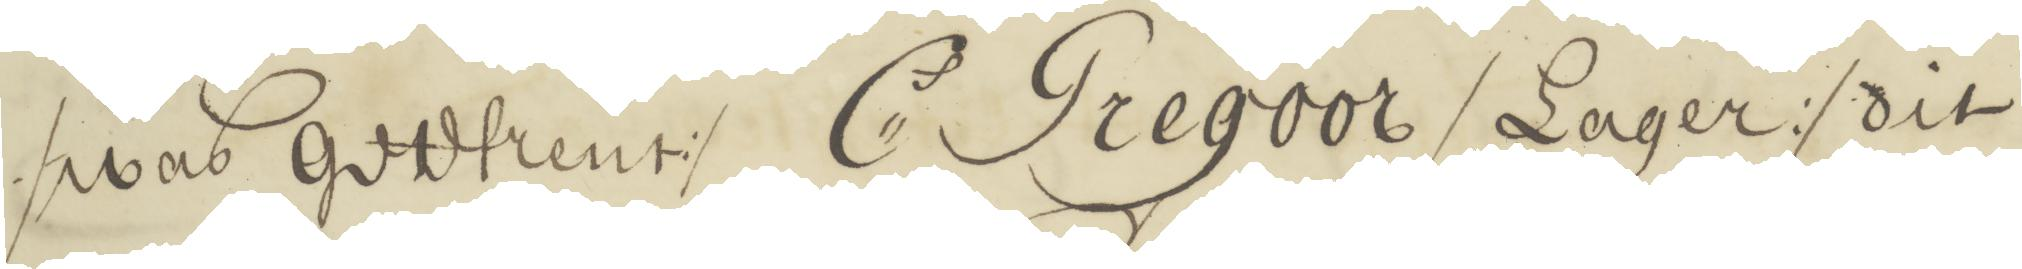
/was getekent:/ C:s Gregoor/ lager:/ dit
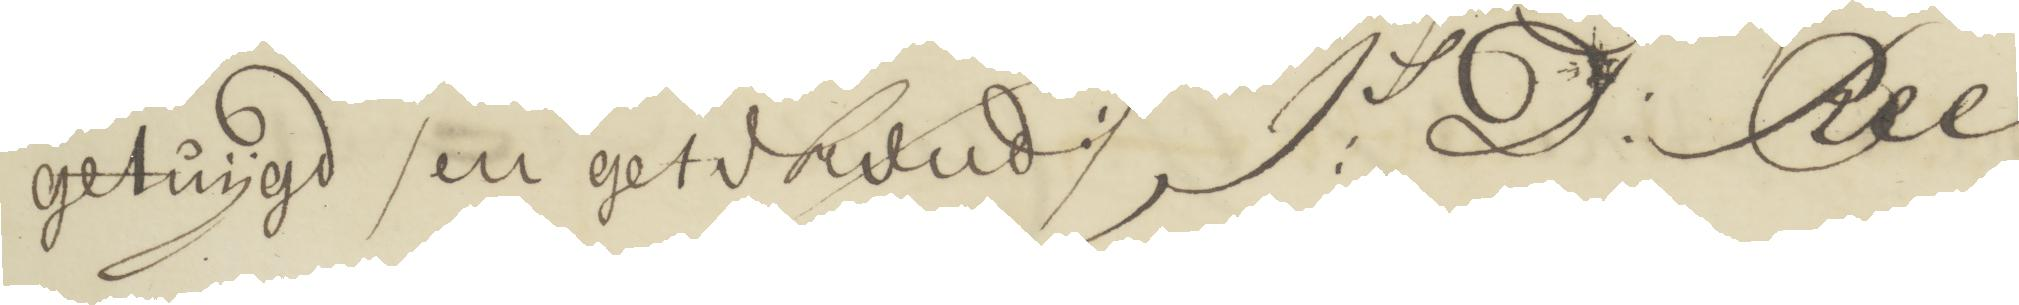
getuijgd /en getekend:/ I:s D: Ree
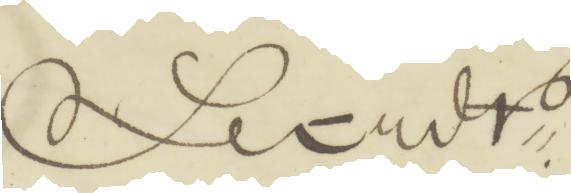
Lecret:s
